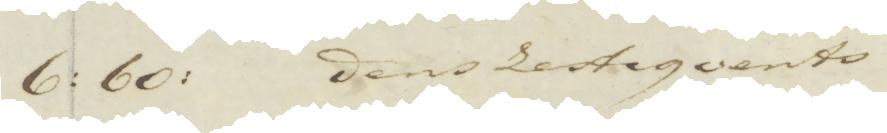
x 6: 60: dens zestig cents
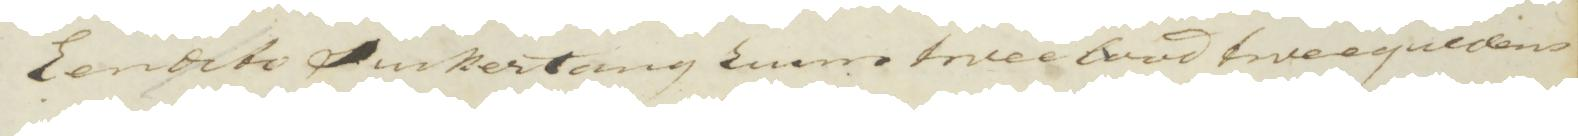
Een dito Suikertang ruim twee lood twee guldens
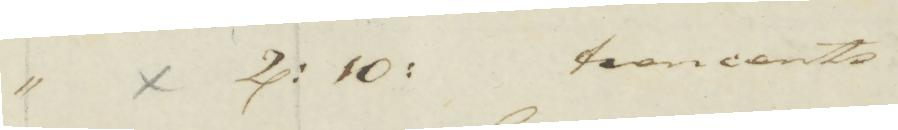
„ x 2:10: tien cents
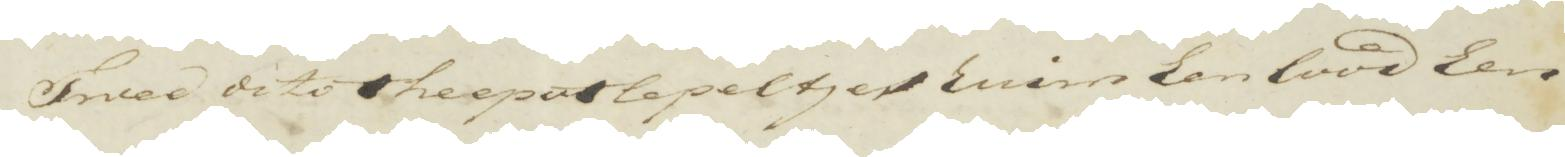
Twee dito theepot lepeltjes ruim Een lood Een
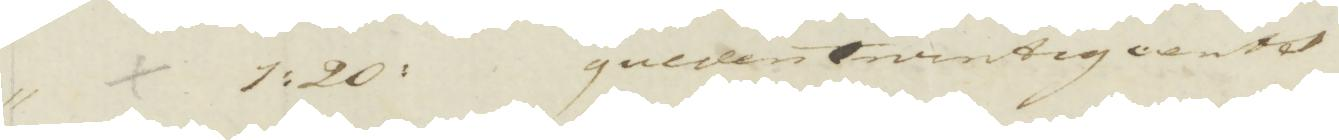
„ x 1: 20: gulden twintig cents
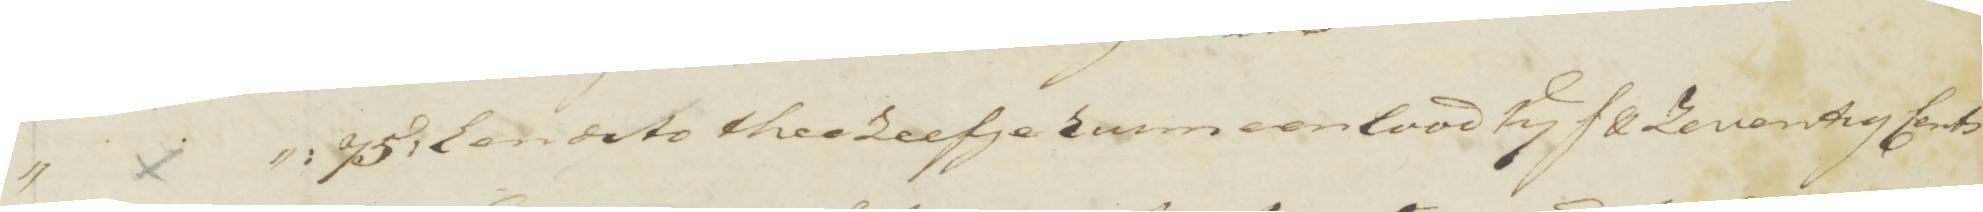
„ x „: 75:Een dito thee zeefje ruim een lood vyf & zeventig Cents
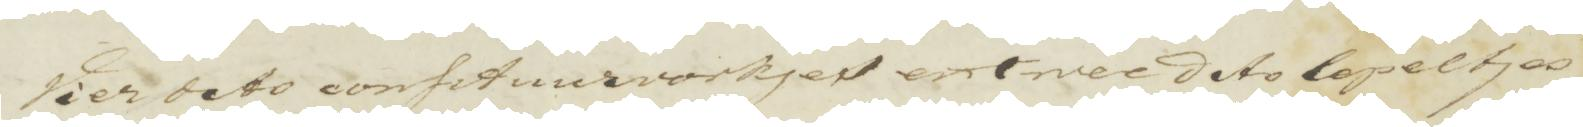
Vier dito confituurvorkjes en twee dito lepeltjes
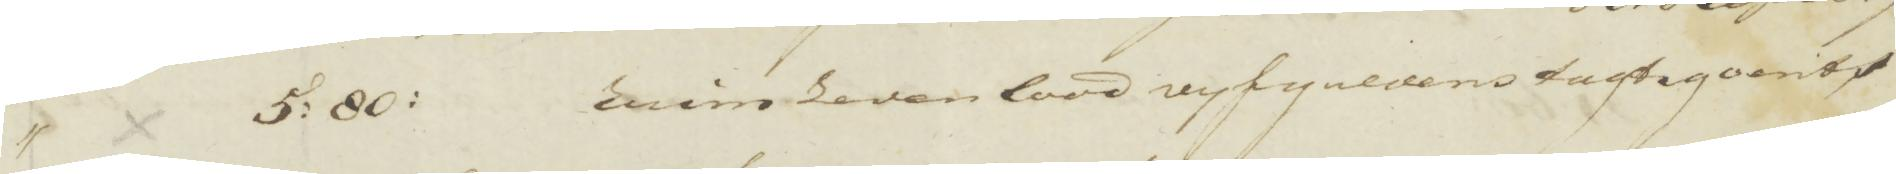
„ x 5: 80: ruim zeven lood vyf guldens tagtig cents
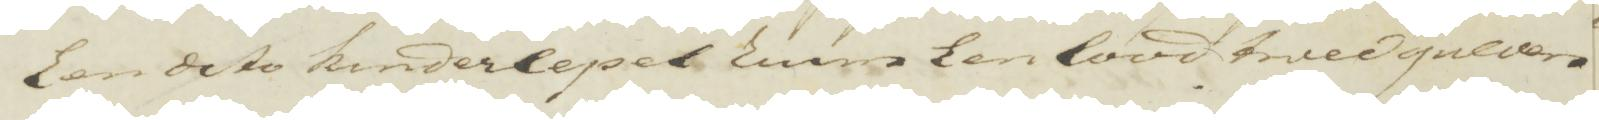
Een dito kinderlepel ruim Een lood twee gulden
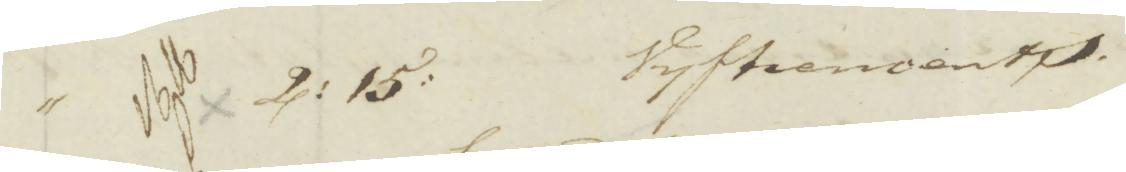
„ x 2: 15: Vyftien cents.
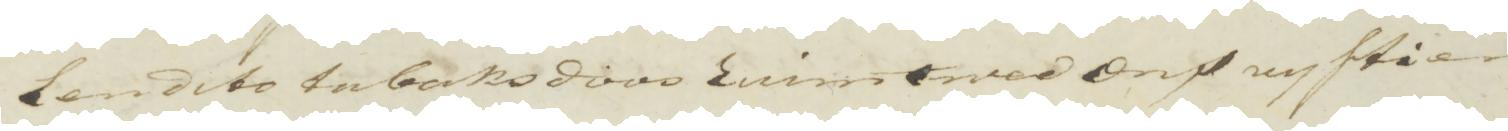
Een dito tabaks doos ruim twee ons vyftien
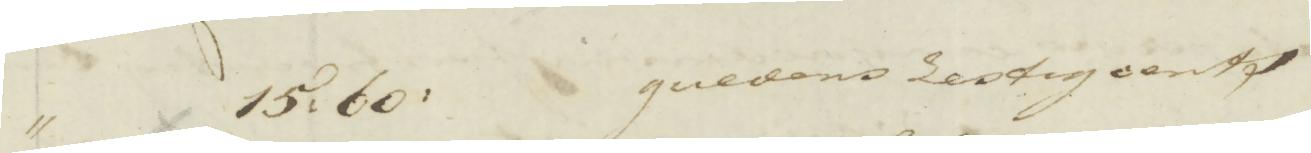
„ x 15: 60: guldens zestig cents
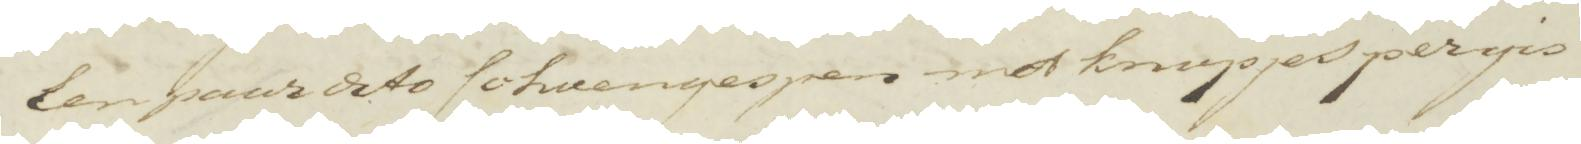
Een paar dito schoengespen met knopjes per gis
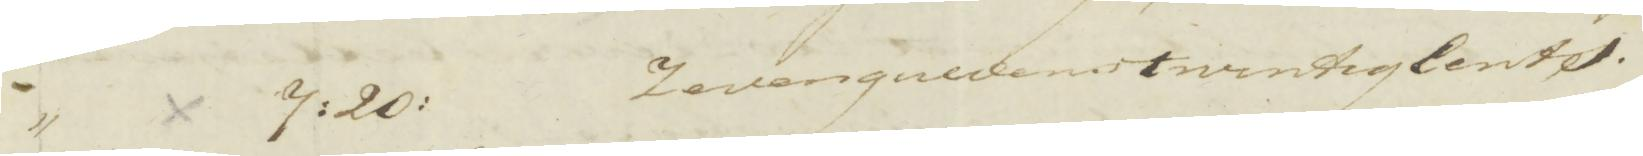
„ x 7: 20: Zeven guldens twintig Cents.
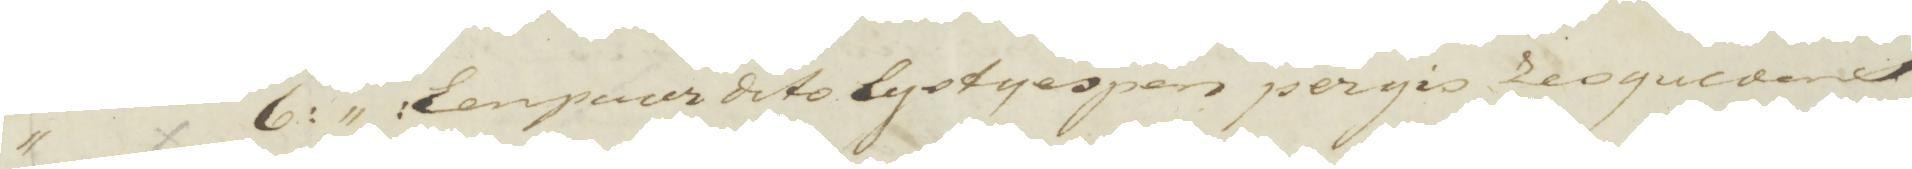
„ x 6: „ :Een paar dito lystgespen per gis Zes guldens
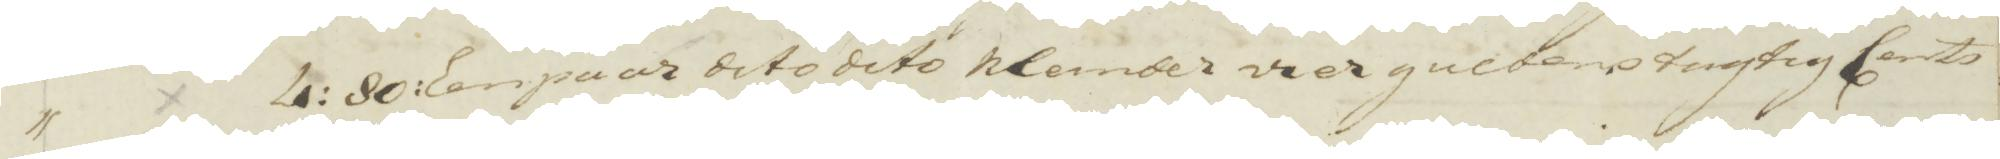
„ x 4: 80: Een paar dito dit Kleinder vier guldens tagtig Cents
